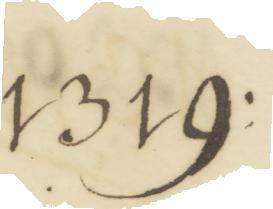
1319:
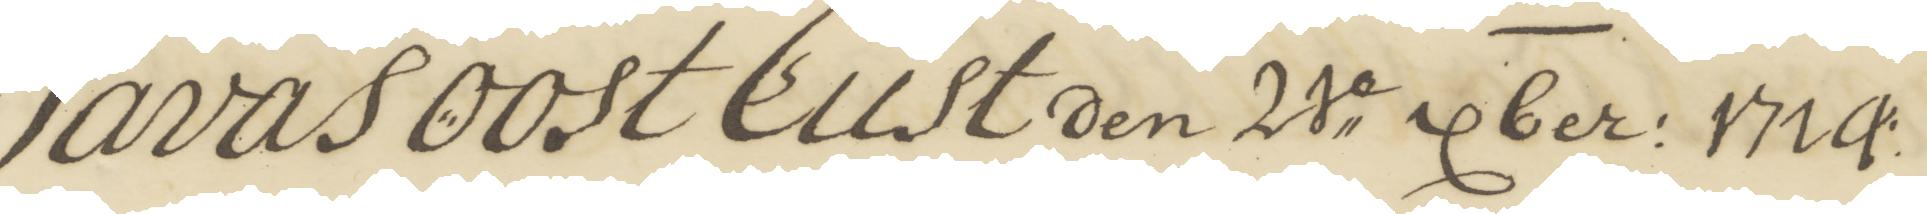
Java's oost Cust den 21„e xber: 1714:
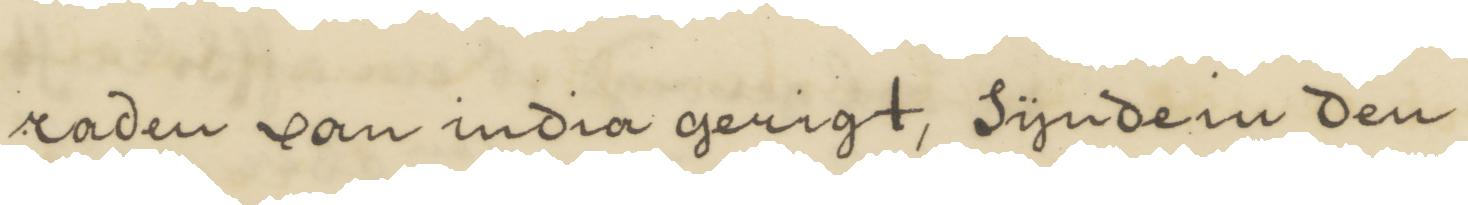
raden van india gerigt, sijnde in den
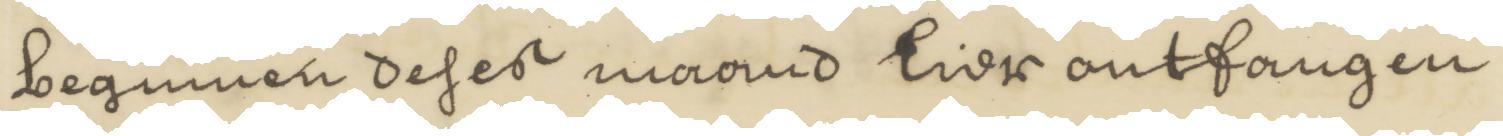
beginnen deses maand hier ontfangen
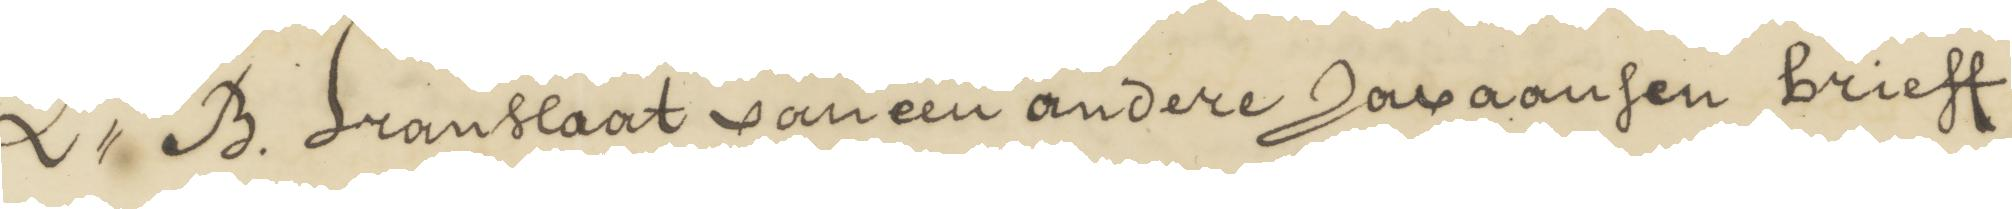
L„na B. Translaat van een andere Javaansen brieff
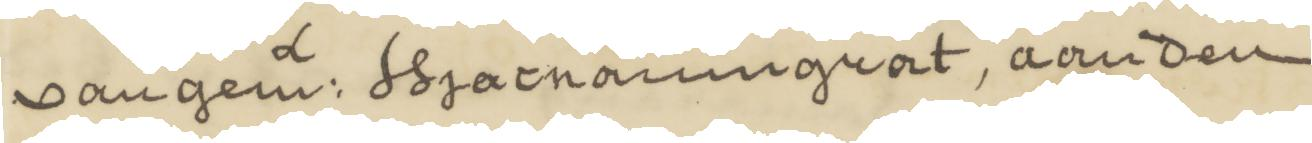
van gem:e tsjacraningrat, aan den
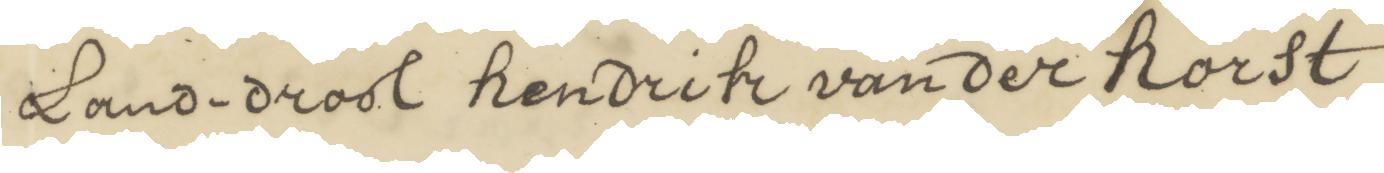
Land-drost Hendrik van der Horst
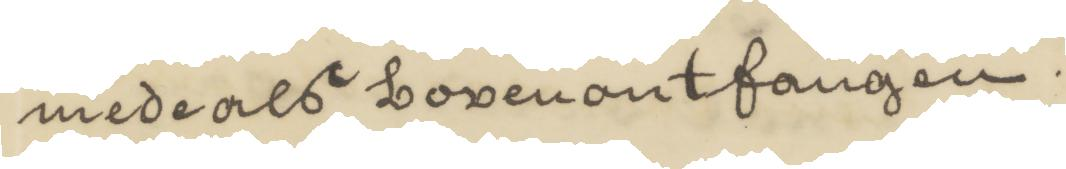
mede als boven ontfangen.
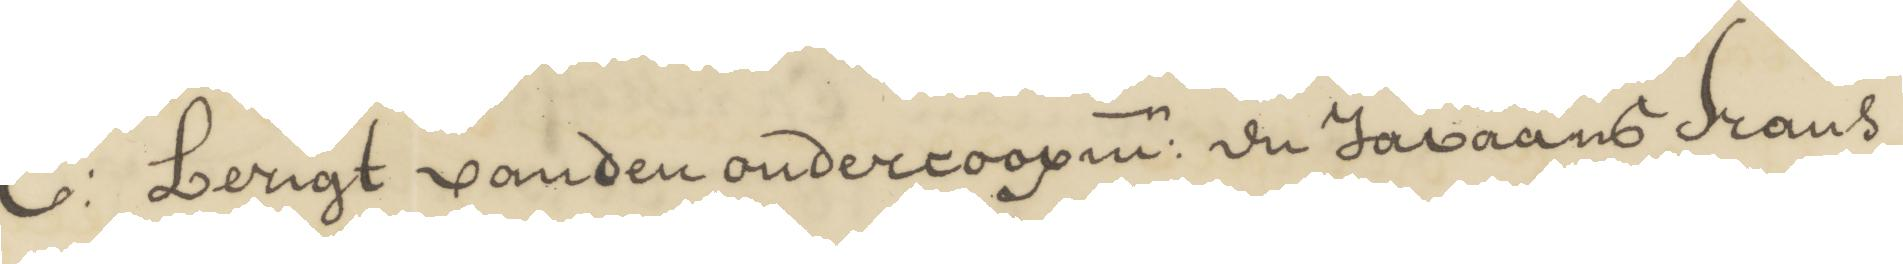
C: berigt van den ondercoopm:n en Javaans trans
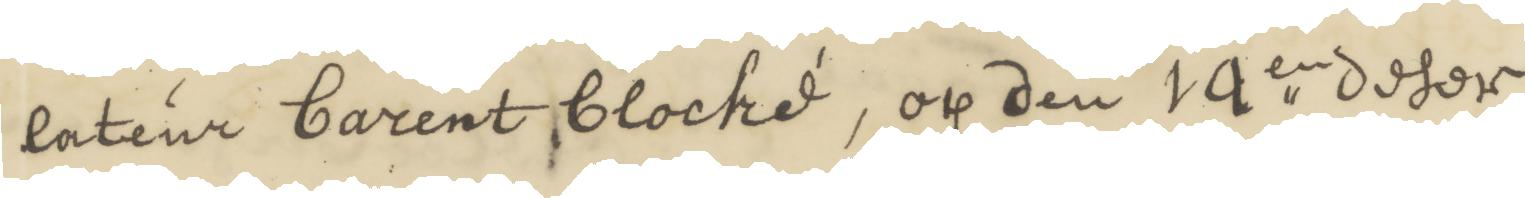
lateur barent blocke, op den 14en deser
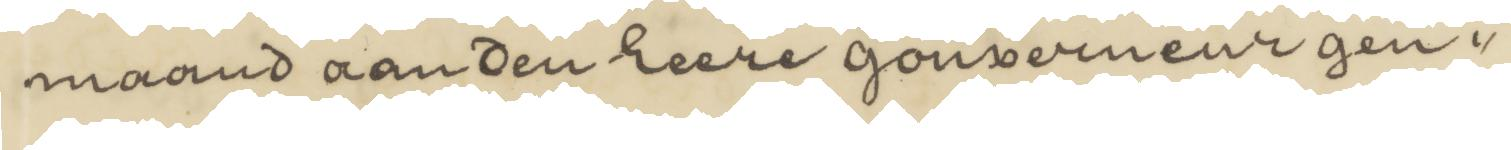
maand aan den heere gouverneur gen„e
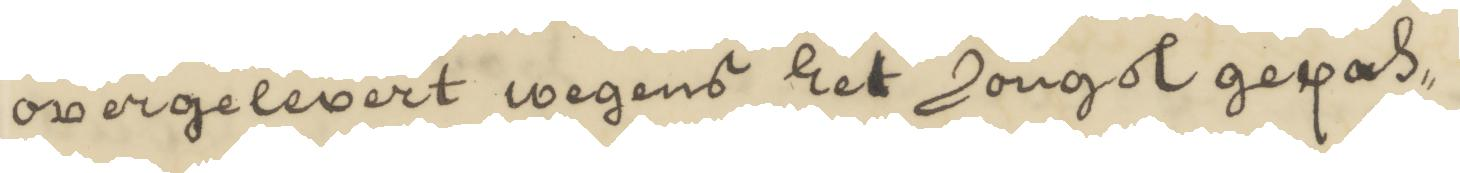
overgelevert wegens het jongst gepas„
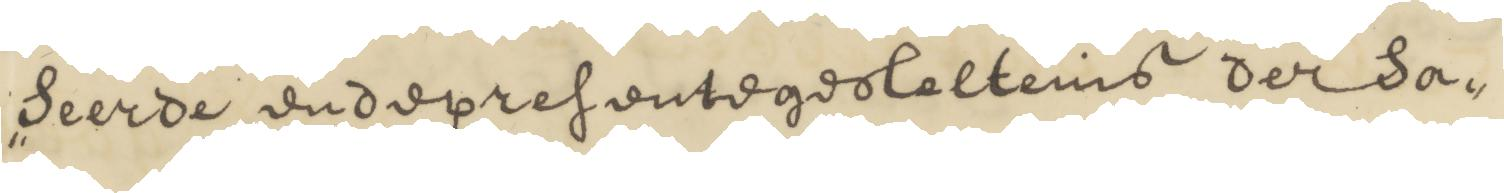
„seerde en de presente gesteltenis der sa„
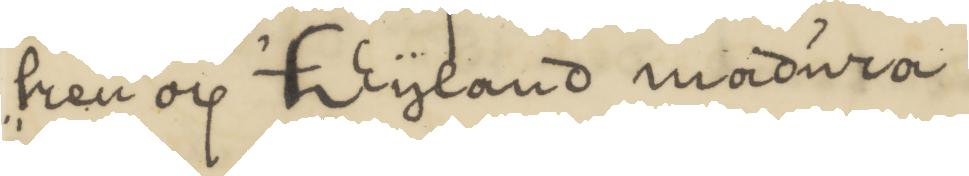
„ken op ’tEijland madura
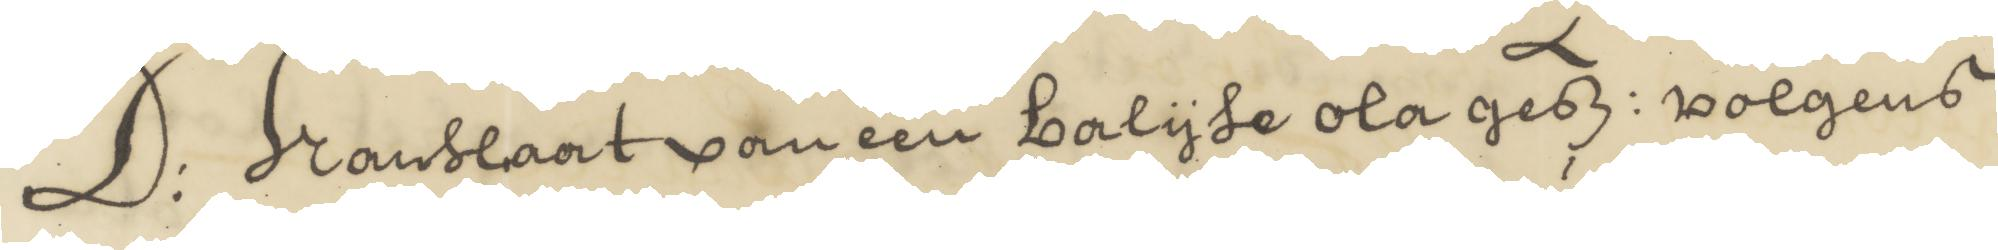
D: Translaat van een balijse ola ges: volgens
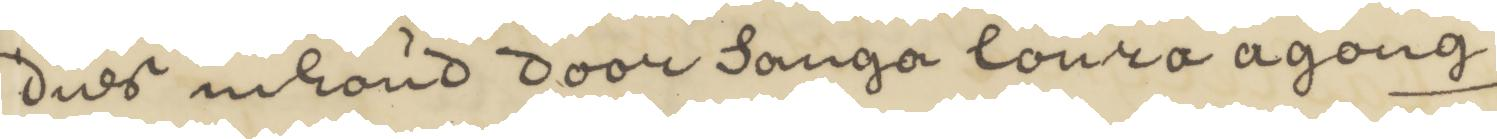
dies inhoud door sanga loura agong
